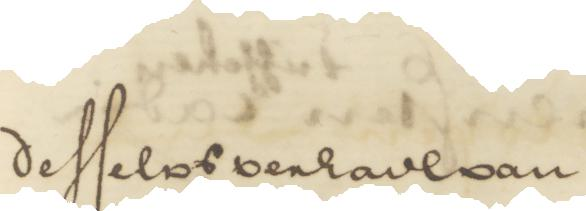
desselvs verhael van
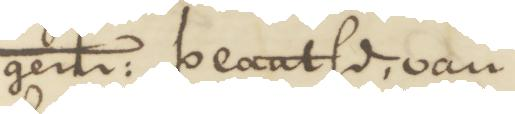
gem: plaatse, van
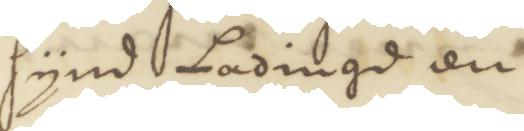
sijne ladinge en
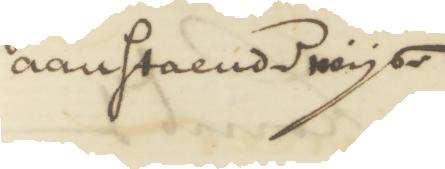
aanstaende reijse
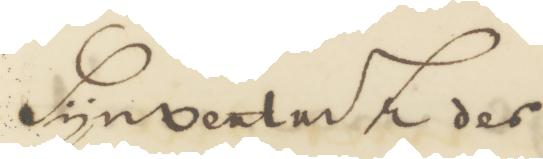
sijn vertrek des
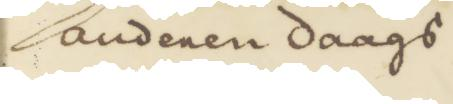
anderen daags
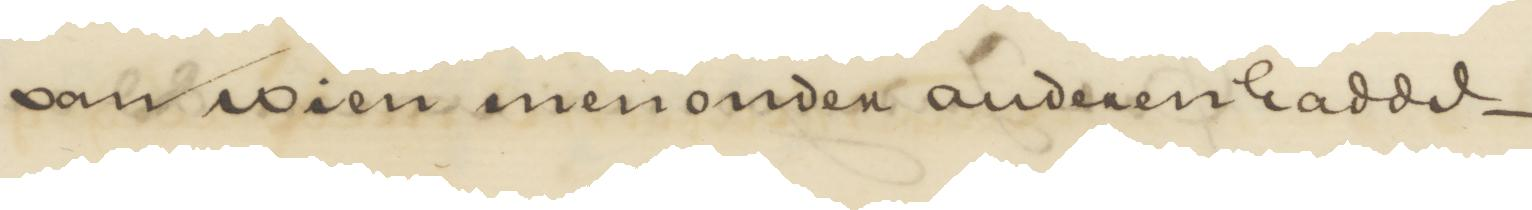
van wien men onder anderen hadde
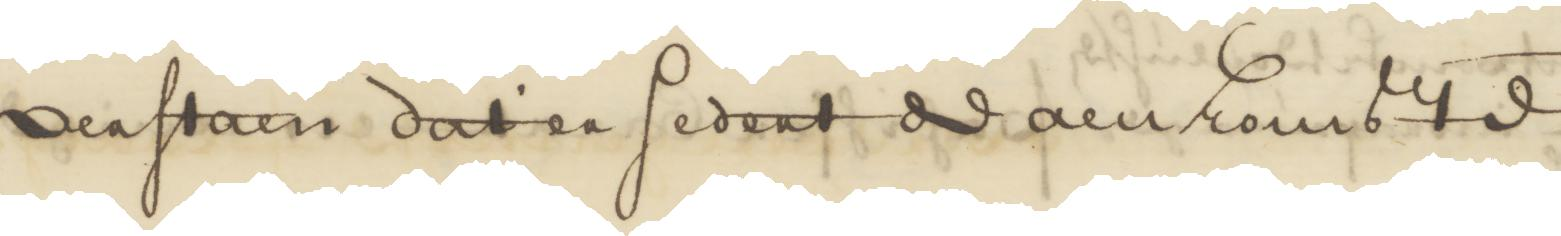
verstaen dat er sedert de aenkomste
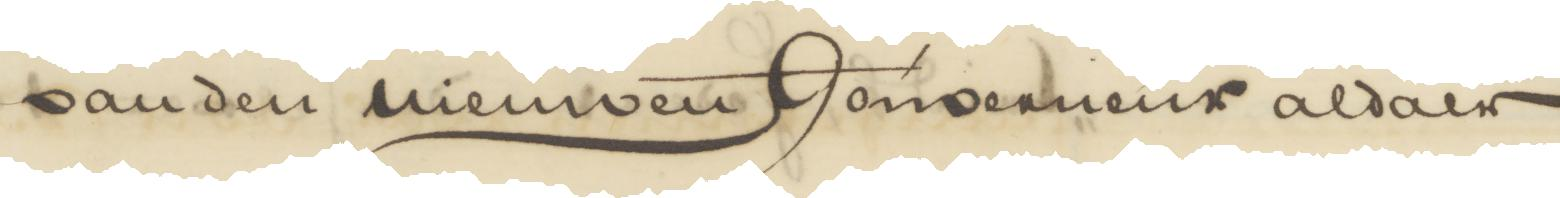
van den nieuwen Gouverneur aldaer
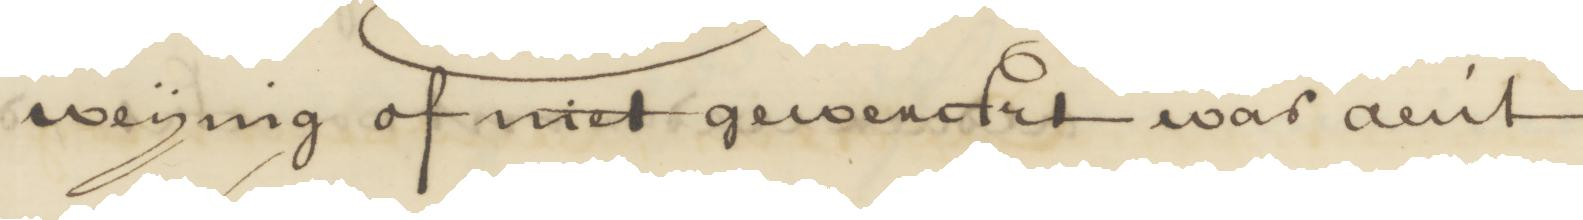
weijnig of niet gewerckt was aen’t
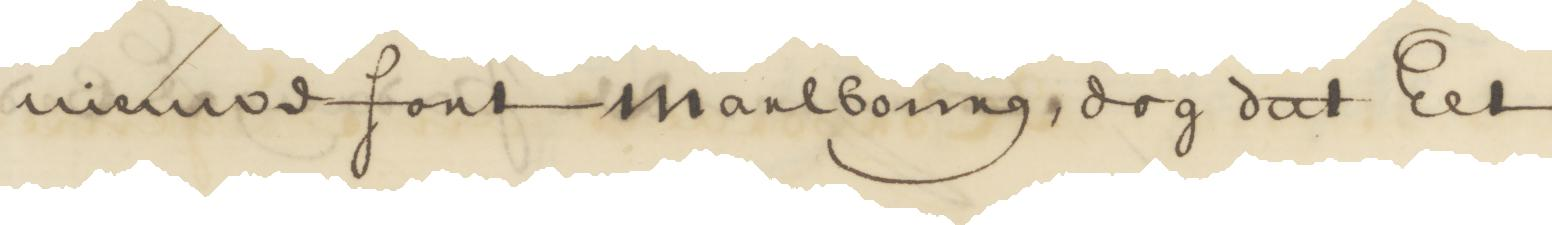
nieuwe fort Marlbourg, dog dat het
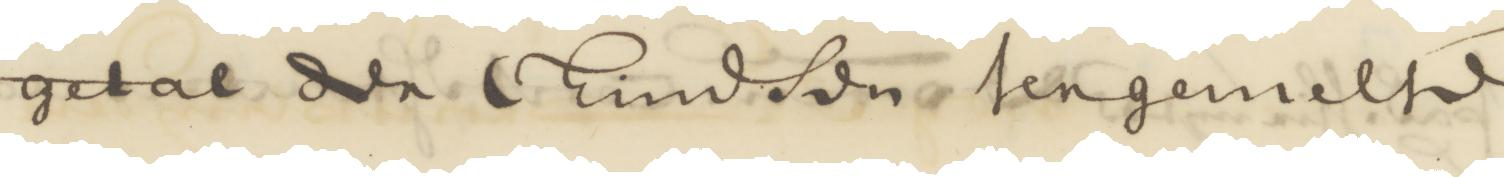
getal der Chinesen ter gemelte
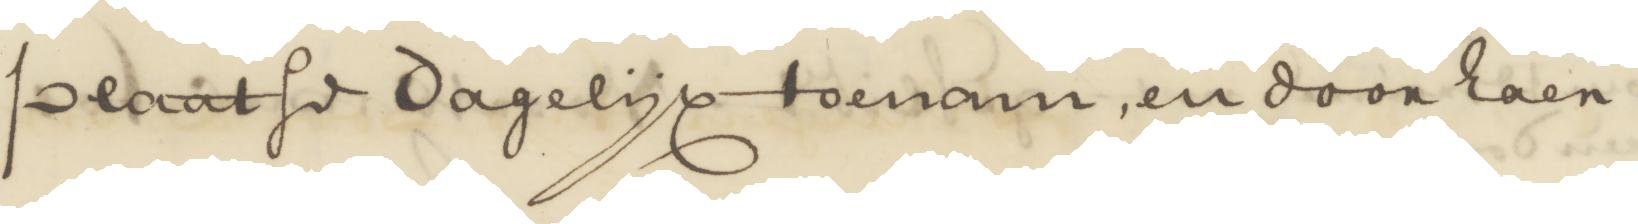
plaatse dagelijx toenam, en door haer
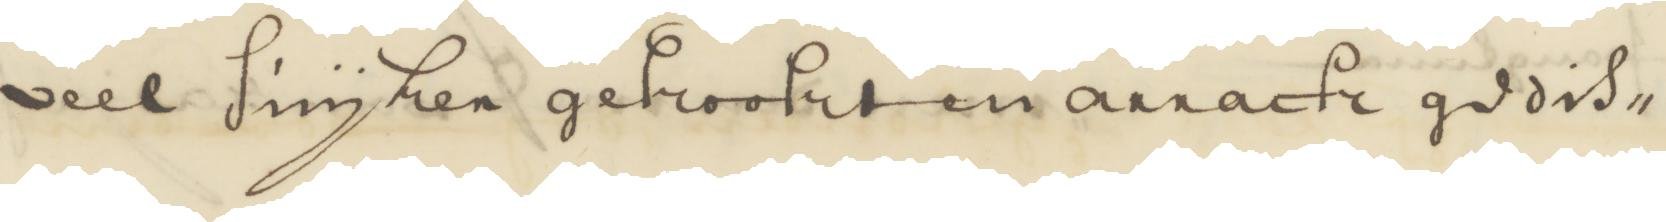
veel suijker gekookt en arrack gedis„
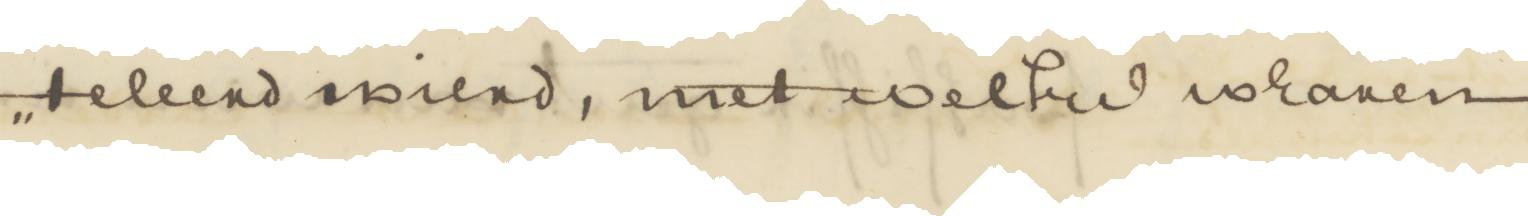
„ teleerd wierd, met welke wharen
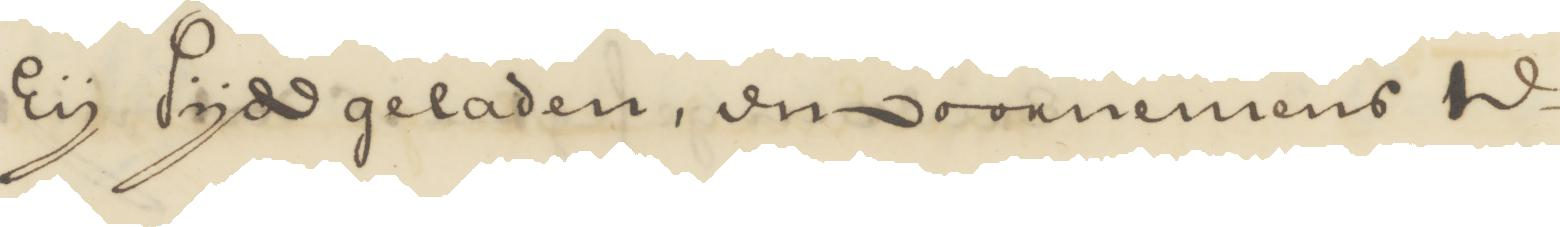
hij sijde geladen, en voornemens te
